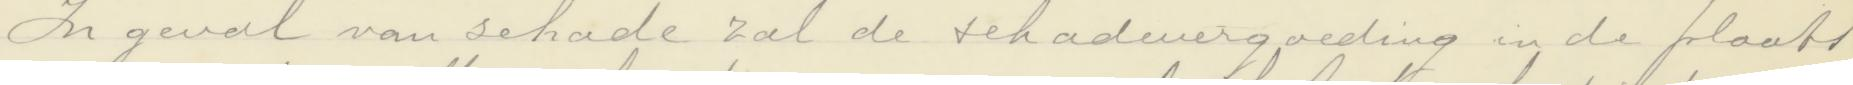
In geval van schade zal de schadevergoeding in de plaats
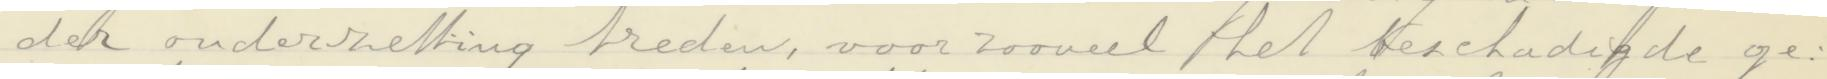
der onderzetting treden, voor zooveel het beschadigde ge:
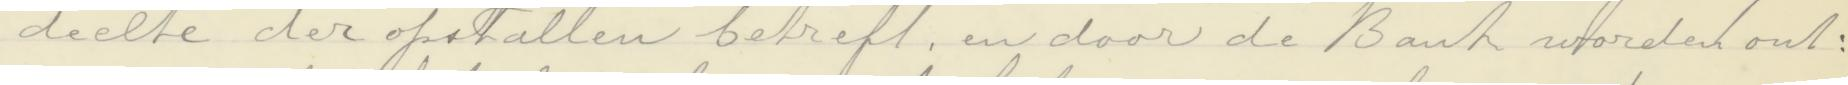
deelte der opstallen betreft, en door de Bank worden ont
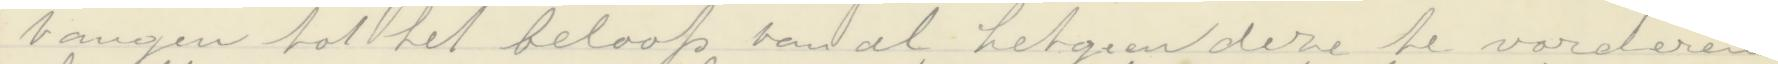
vangen tot het beloop van al hetgeen deze te vorderen
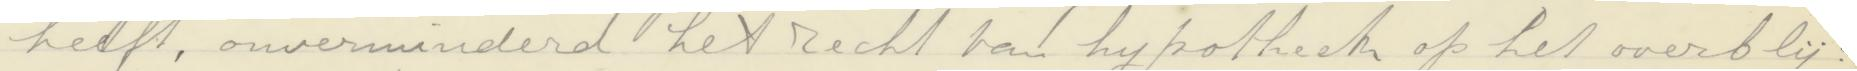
heeft, onverminderd het recht van hypotheek op het overblij:
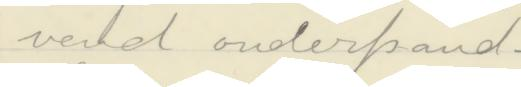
vend onderpand
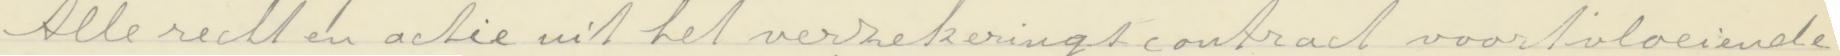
Alle recht en actie uit het verzekerings contract voortvloeiende
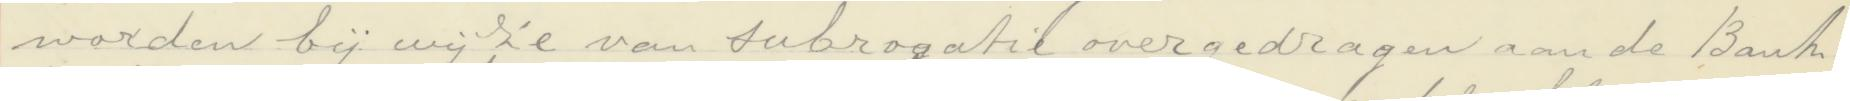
worden bij wijze van subrogatie overgedragen aan de Bank
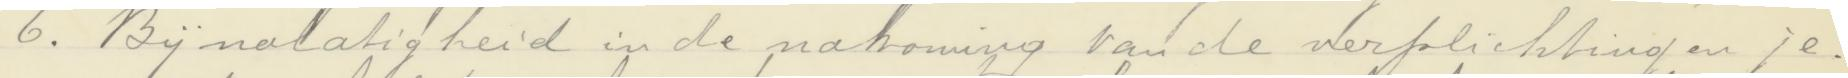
6. Bij nalatigheid in de nakoming van de verplichtingen je
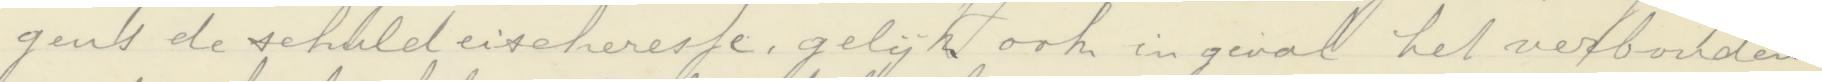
gens de schuld eischeresse, gelijk ook ingeval het verbonden
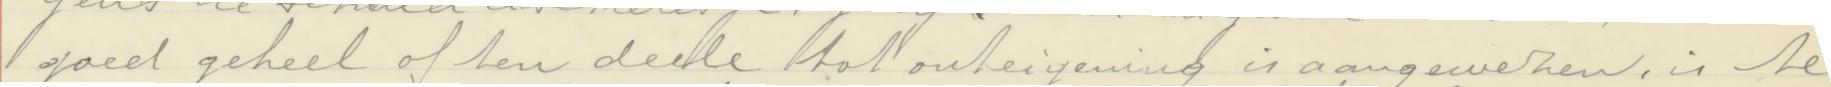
goed geheel of ten deele tot onteigening is aangewezen, is te
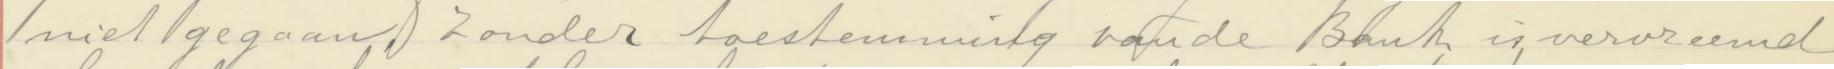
niet gegaan zonder toestemming van de Bank is vervreemd
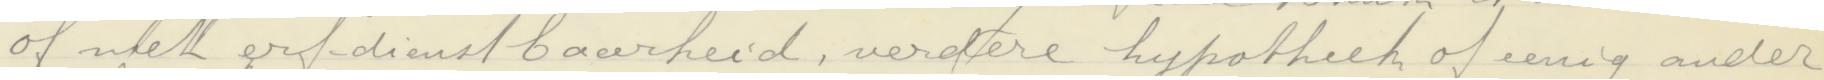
of met erf-dientsbaarheid, verdere hypotheek of eenig ander
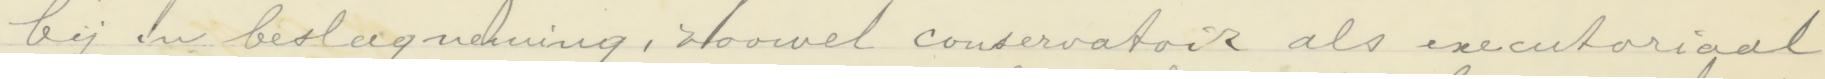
bij in beslagneming, zoowel conservatoir als executoriaal
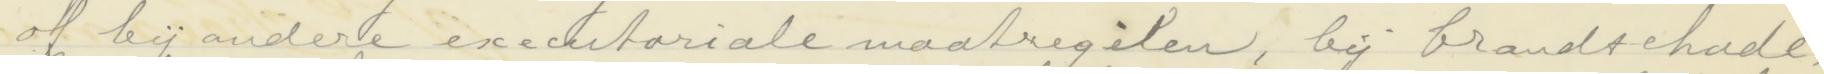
of bij andere executoriale maatregelen, bij brandschade
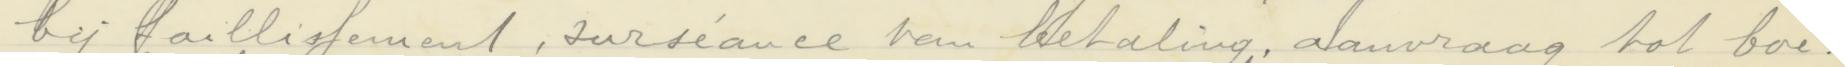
bij faillissement, surséance van betaling, aanvraag tot boe:
